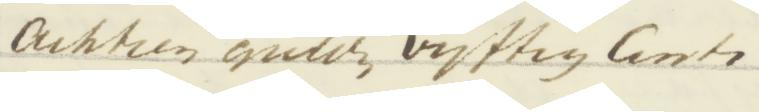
achtien gulden vyftig Cents
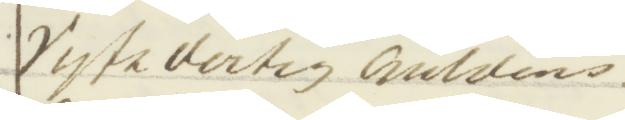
Vyf & dertig Guldens
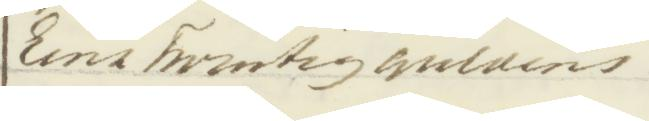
Een & twintig guldens
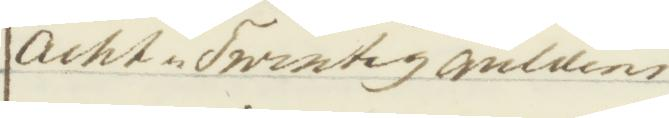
Acht en Twintig guldens
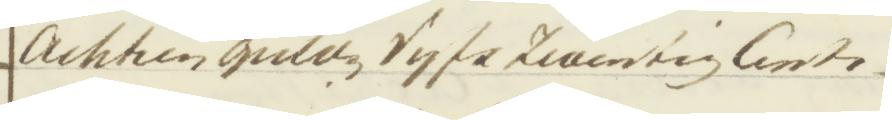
Achtien gulden Vyf en Zeventig Cents
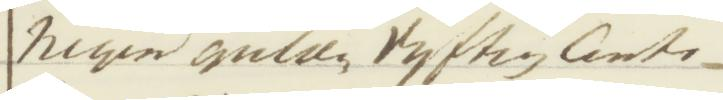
Negen gulden Vyftig Cents
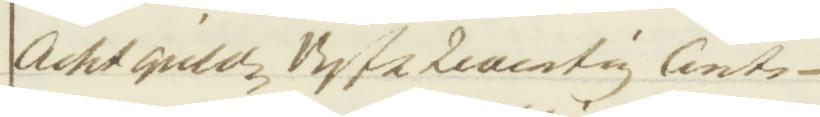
Acht gulden Vyf & Zeventig Cents
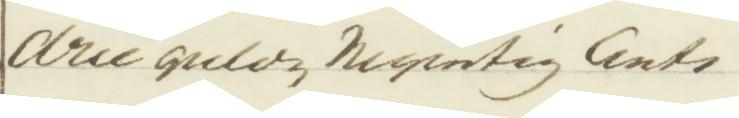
drie gulden negentig Cents
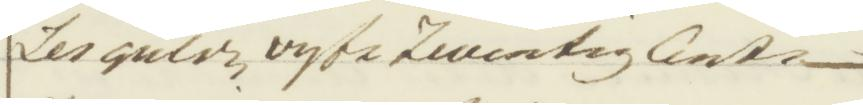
Zes gulden vyf & zeventig Cents
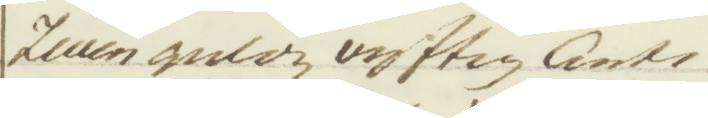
Zeven gulden vyftig Cents
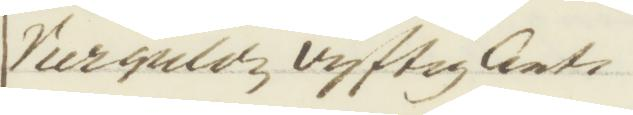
Vier gulden vyftig Cents
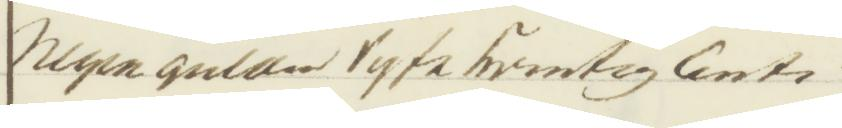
Negen gulden Vyf en Twintig Cents
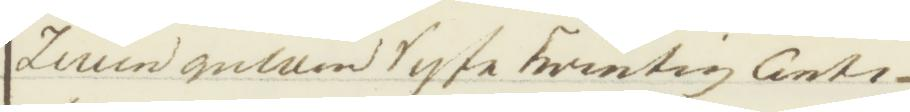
Zeven gulden Vyfen Twintig Cents
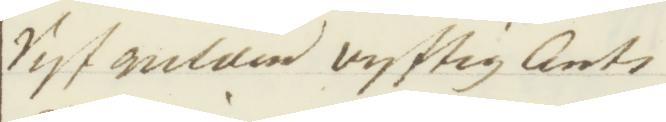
Vyf gulden vyftig Cents
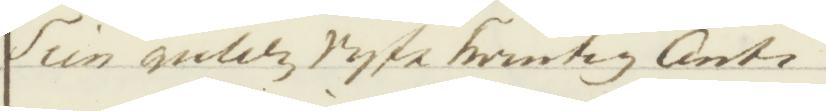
Tien gulden Vyf en Twintig Cents
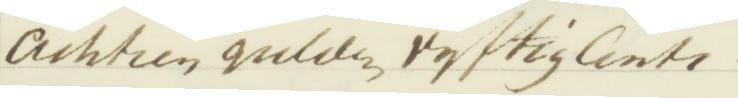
Achtien gulden vyftig Cents
